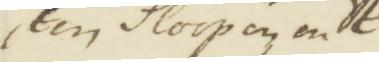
,ten sloopen en 't
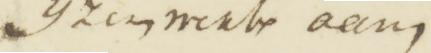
yzerwerk aan
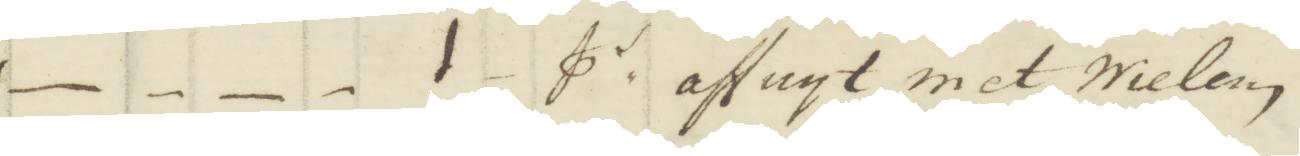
— — — — 1 — p„s affuyt met wielen
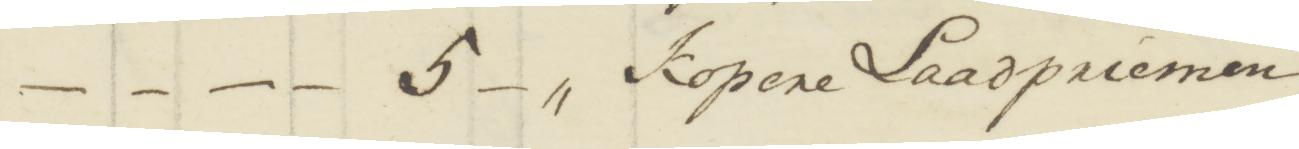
— — — — 5 — „ Kopere Laadpriemen
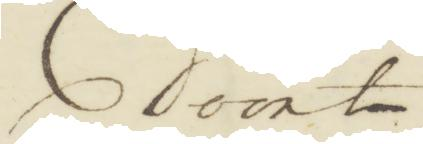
door 't
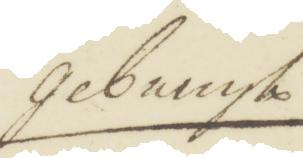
gebruyk
